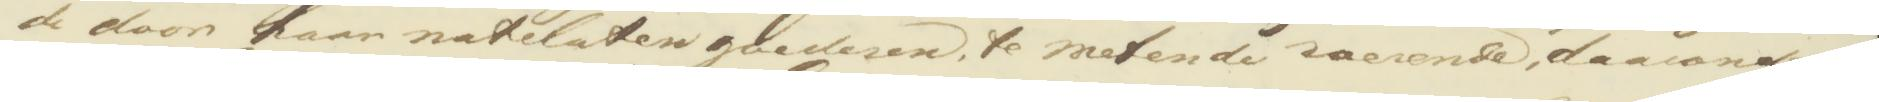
de door haar natelaten goederen, te weten de roerende, daaronder
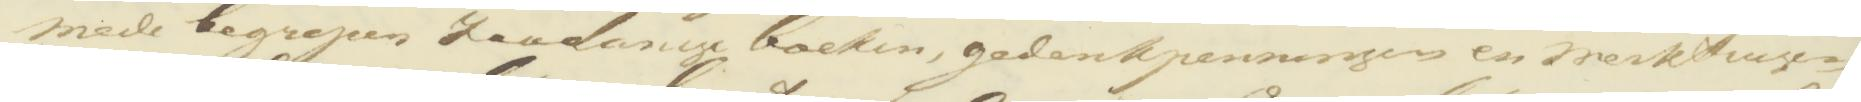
mede begrepen zondanig boeken, gedenkpenningen en werktuigen
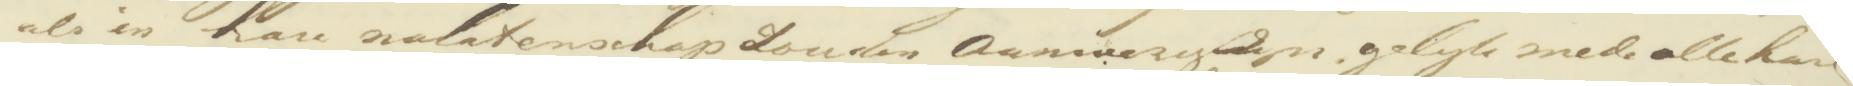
als in hare nalatenschap zouden aanwezig zyn, gelyk mede alle hare
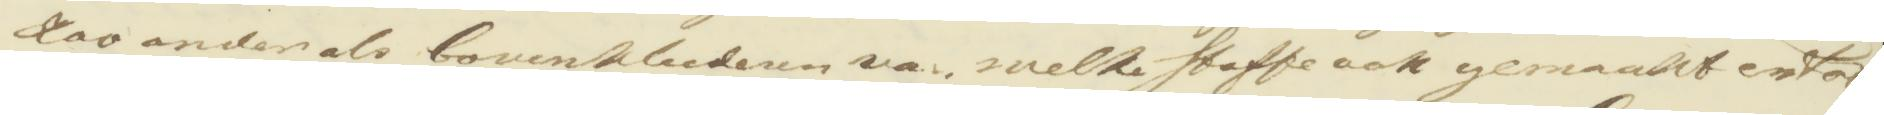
zoo onder als bovenkleederen van welke stoffe ook gemaakt en tot
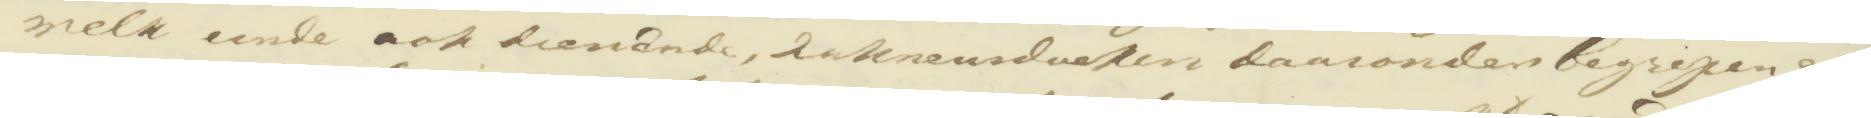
welk einde ook dienende, zakneusdoeken daaronder begrepen en
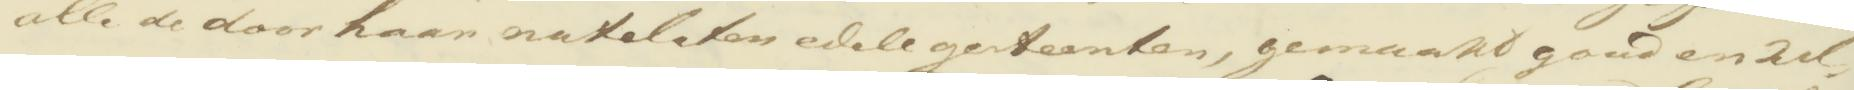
alle de door haar natelaten edele gesteenten, gemaakt goud en zil,
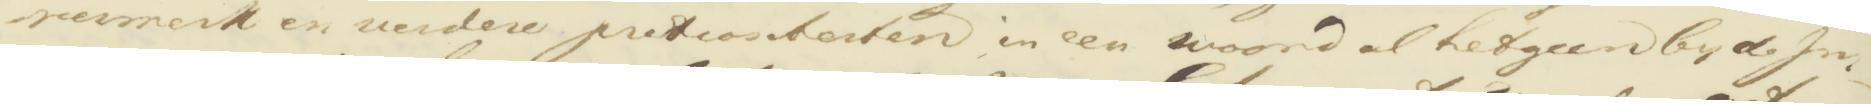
-verwerk en verdere pretiositeiten, in een woord al het geen by de jn,
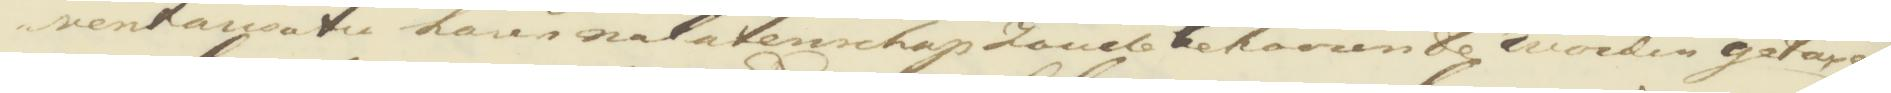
„ventarisatie haren nalatenschap zoude behooren te worden getaxeerd
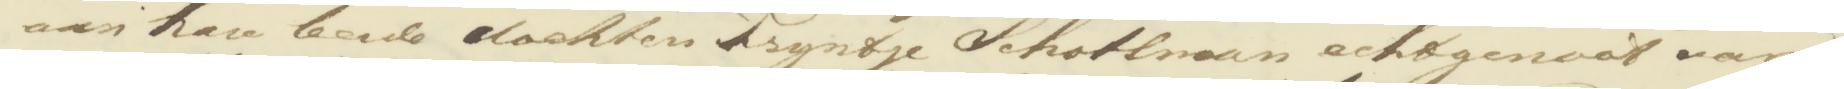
aan hare beide dochter Tryntje Schotsman echtgenoot van
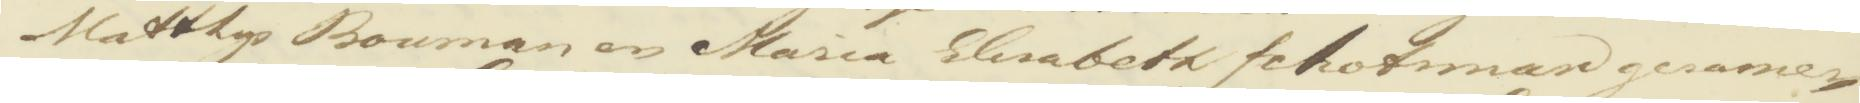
Matthys Bouman en Maria Elisabeth Schotman gesamen,
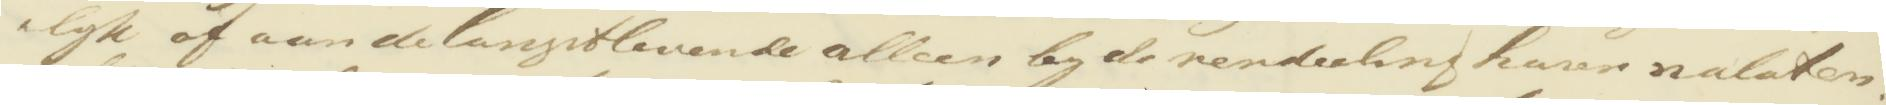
„lyk of aan de langstlevende alleen by de verdeeling harer nalaten
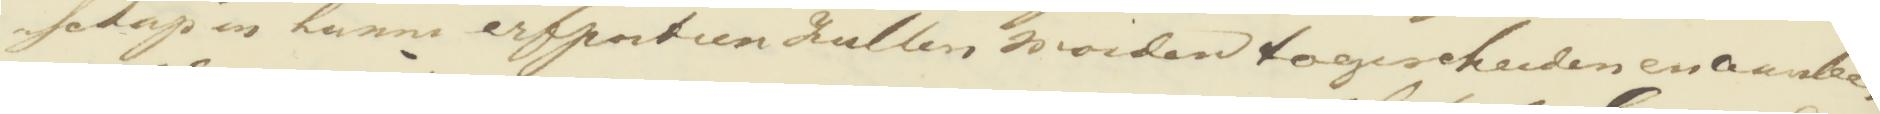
„schap in hunne erfportien zullen worden toegescheiden en aanbe,
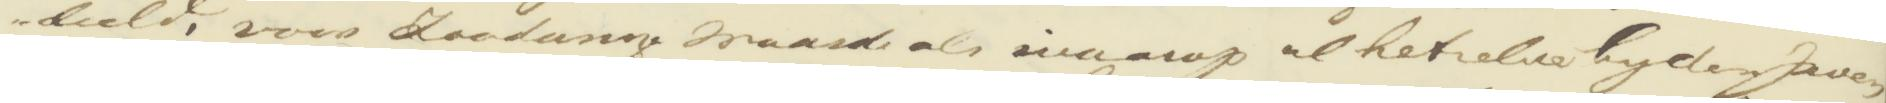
„deeld, voor zoodanige waarde als waarop al hetzelve by den jnven
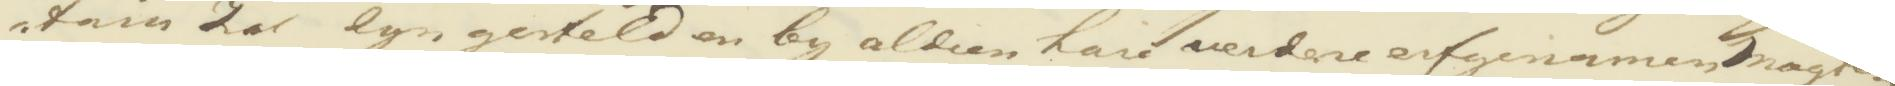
„taris zal zyn gesteld en by aldien hare verdere erfgenamen mogten
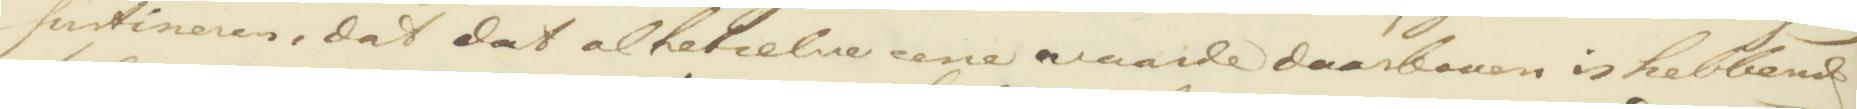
sustineren, dat dat al hetzelve eene waarde daarboven is hebbende
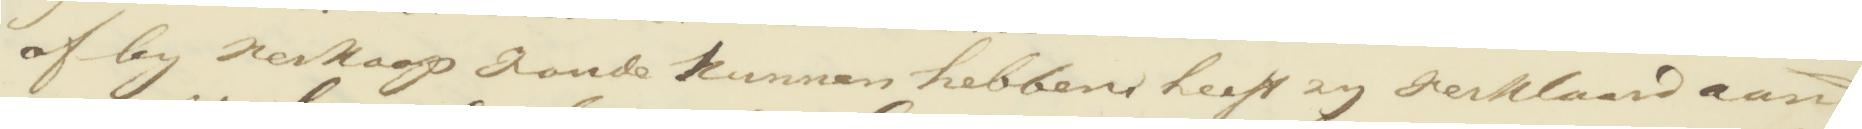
of by verkoop zoude kunnen hebben heeft zy verklaard aan
